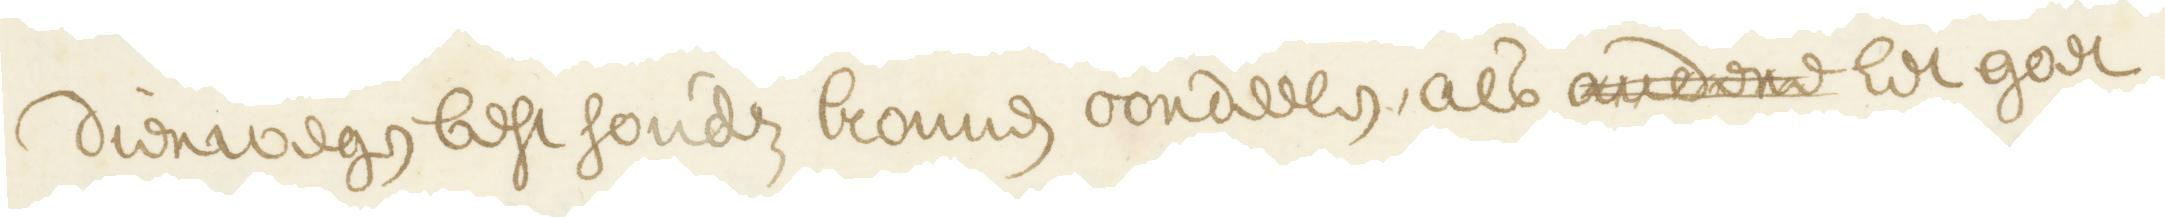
dierwegen best souden konnen oordeelen, als andere het goet
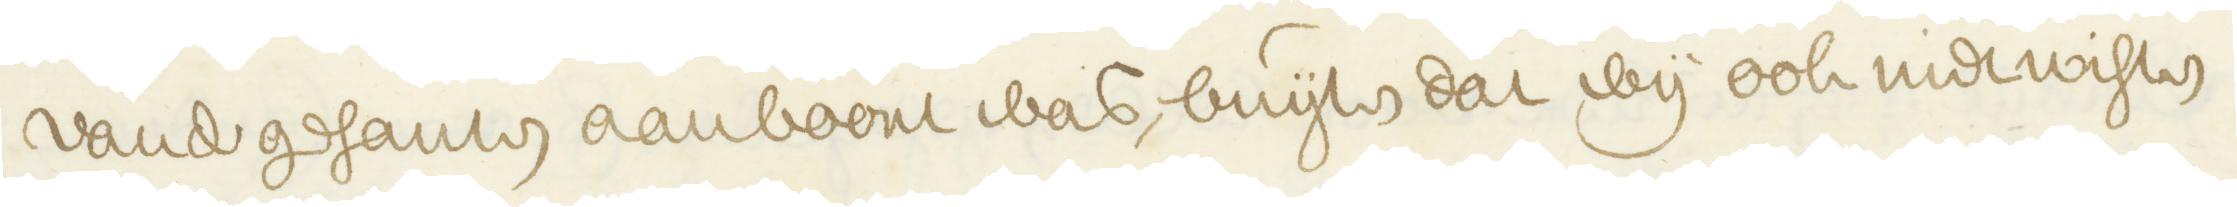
van de gesanten aanboort was, buijten dat wij ook niet wisten
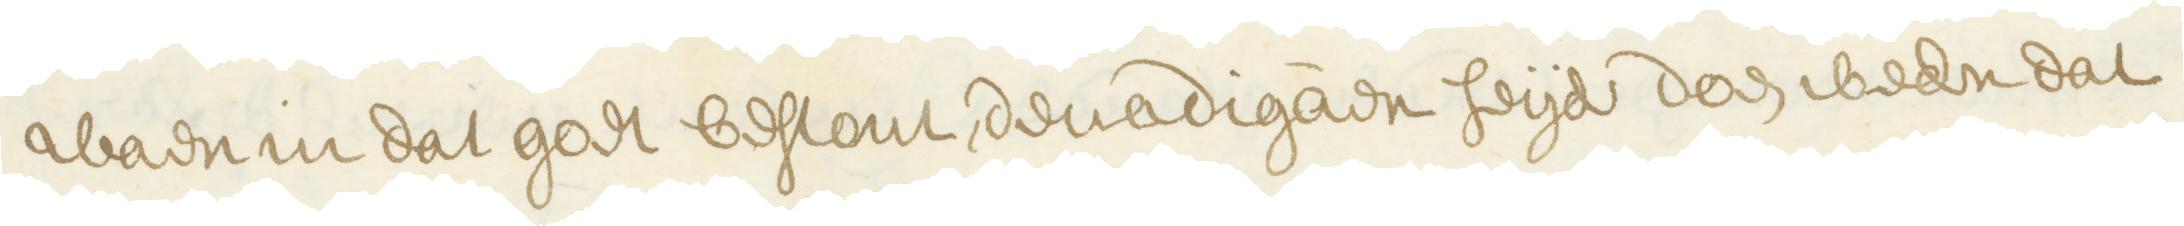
waer in dat goet bestont, denadigaer seijde doen weder dat
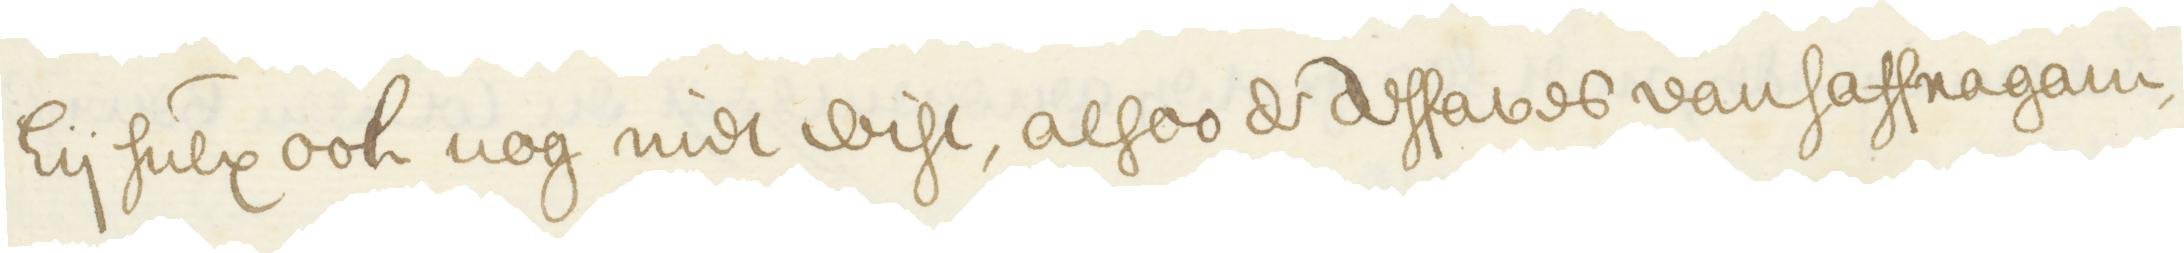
hij sulx ook nog niet wist, alsoo de dessaves van saffragam,
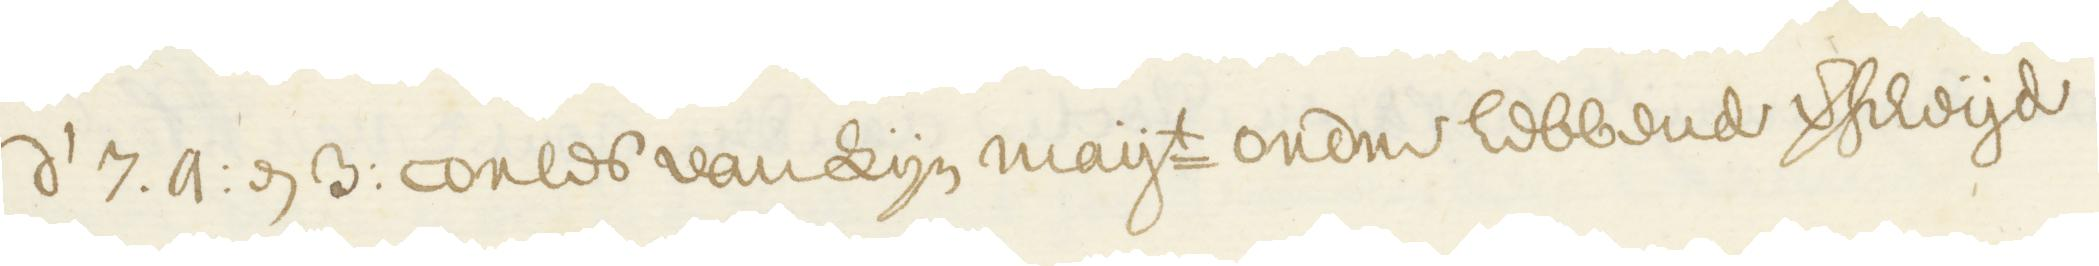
d' 7.4: en 3: corles van zijn maij=t ordre hebbende verscheijde
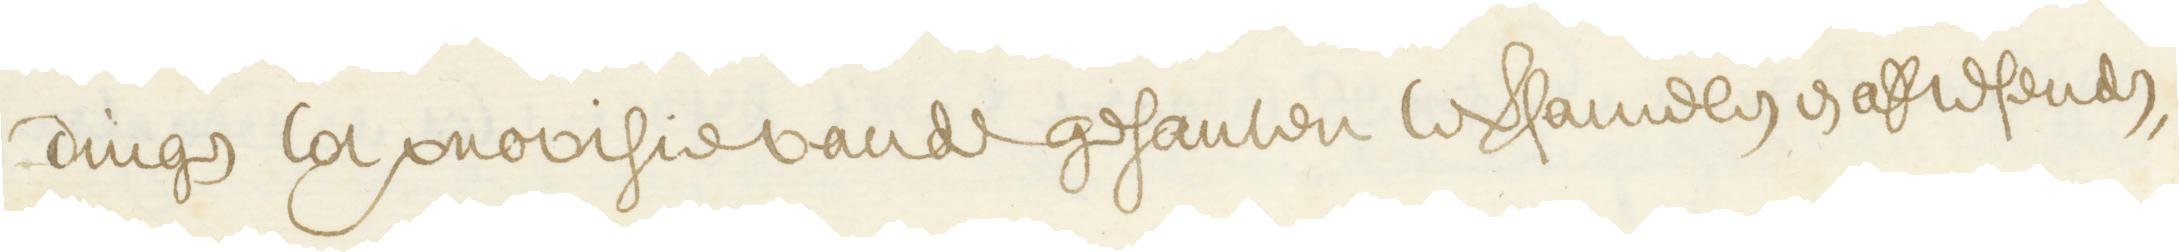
dingen tot provisie vande gesanten te versamelen en aftesenden,
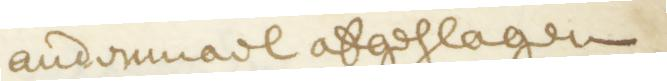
andermael afgeslagen
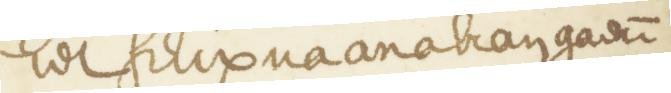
het schip naarakan gaen
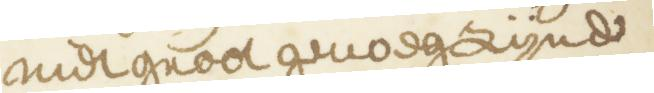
niet groot genoeg zijnde
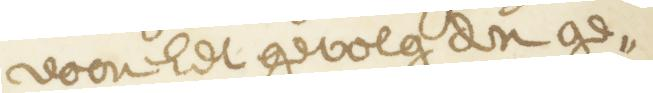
voor het gevolg der ge„
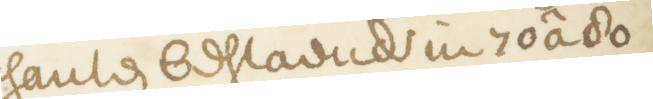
santen bestaende in 70 â 80
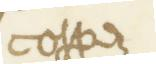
coppen
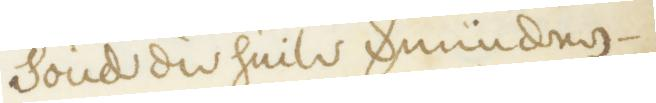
soude die suite verminderen
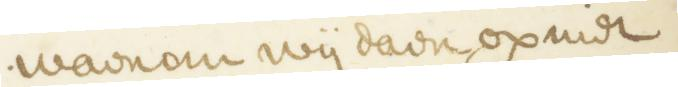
waerom wij daer, op niet
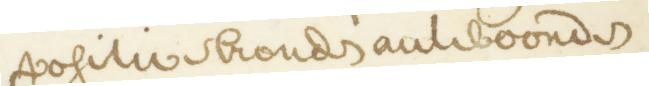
positive konden antwoorden
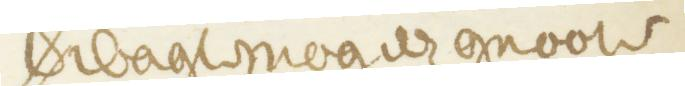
verwagten nog een groote
